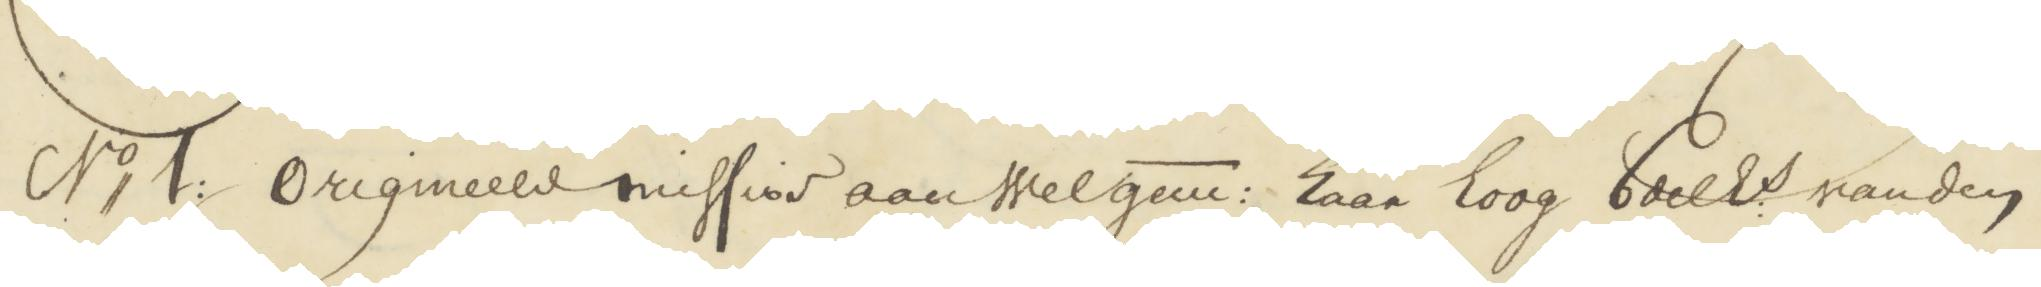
N„o 1: origineele missive aan wel gem: haar hoog Edelh:s van den
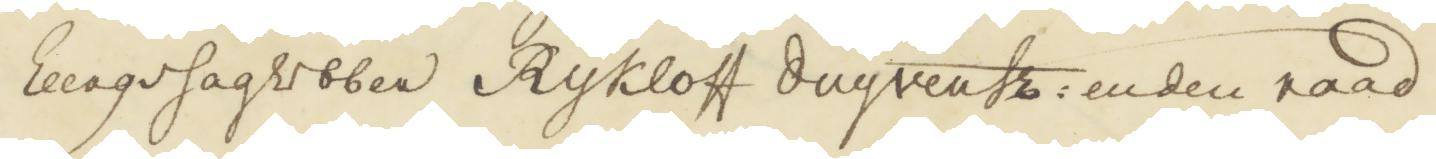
heer gesaghebber Rijkloff duijvensz: en den raad
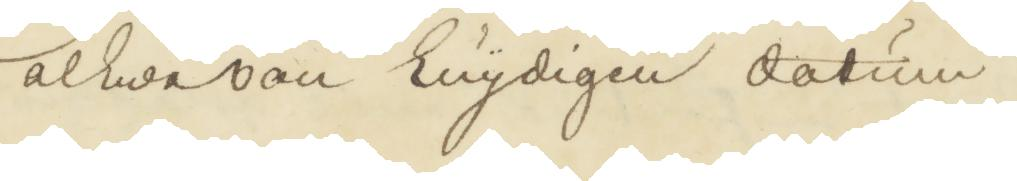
alhier van huijdigen datum
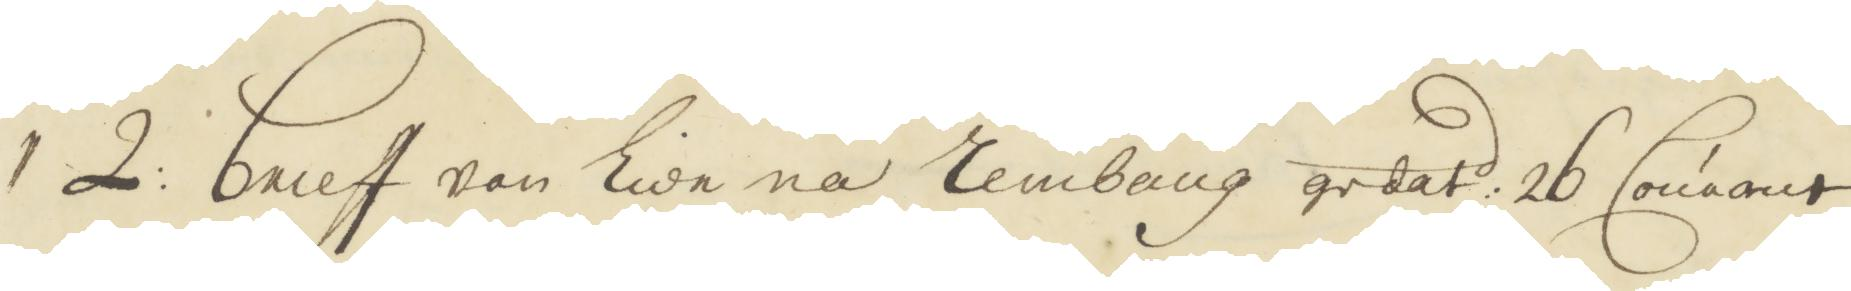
2: brieff van hier na Rembang gedat:d 26 Courant
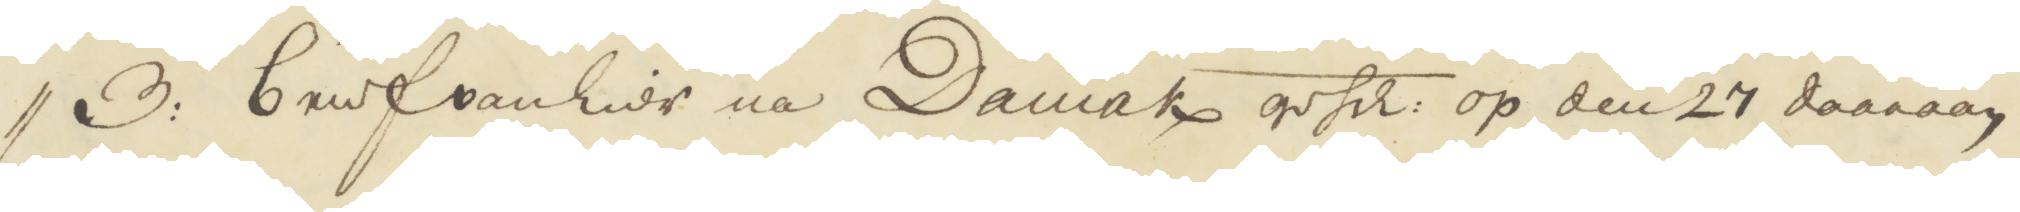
„ 3: brief van hier na Damak gesch: op den 27 daaraan
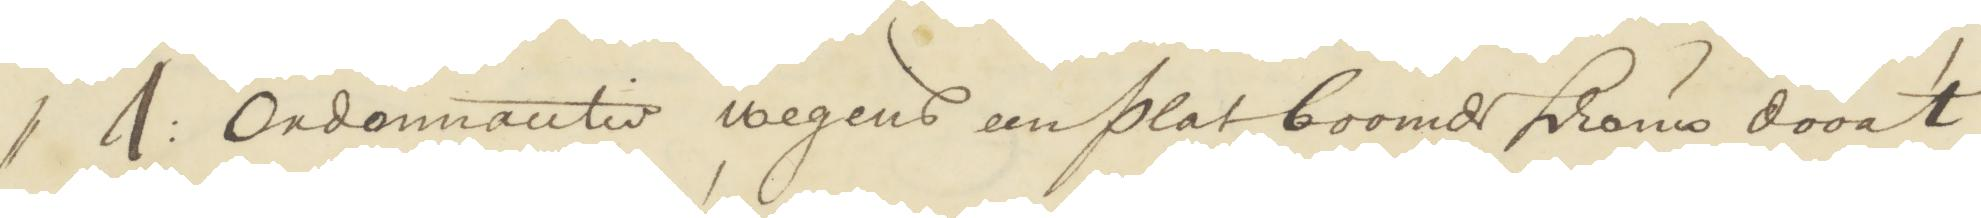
„ 4: Ordonnantie wegens een platboomde schouw door ’t
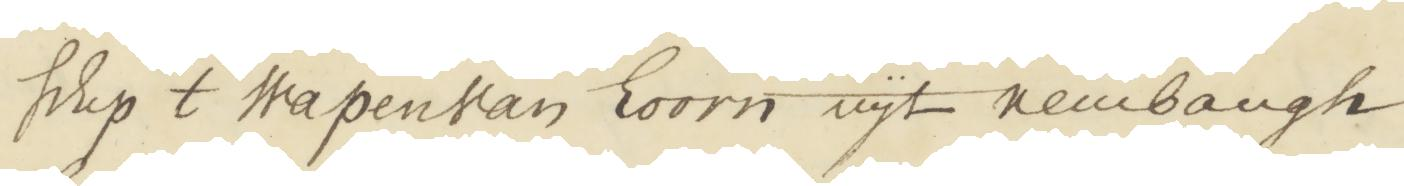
schip ’t wapen van hoorn uijt rembangh
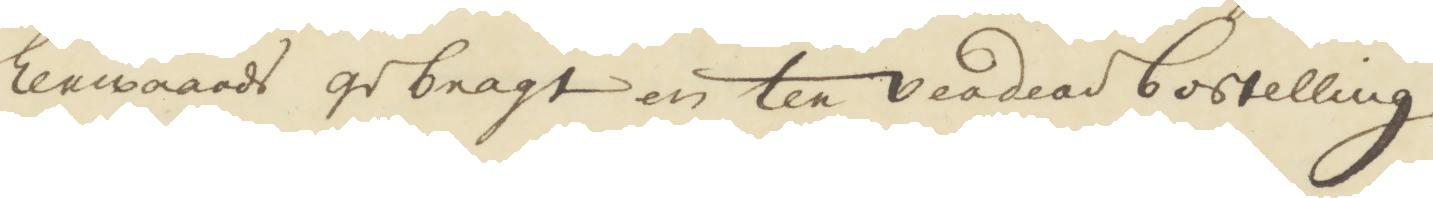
herwaards gebragt en ter verders bestelling
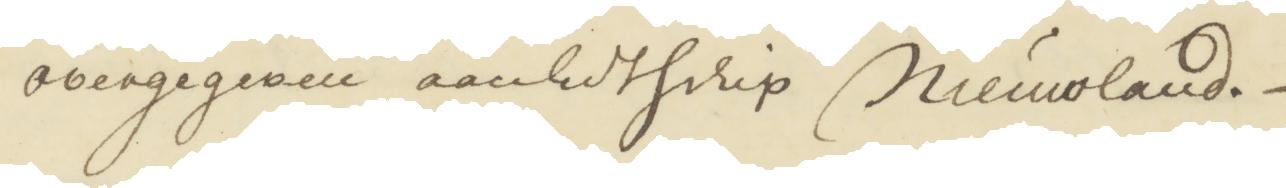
overgegeven aan het schip Nieuwland.
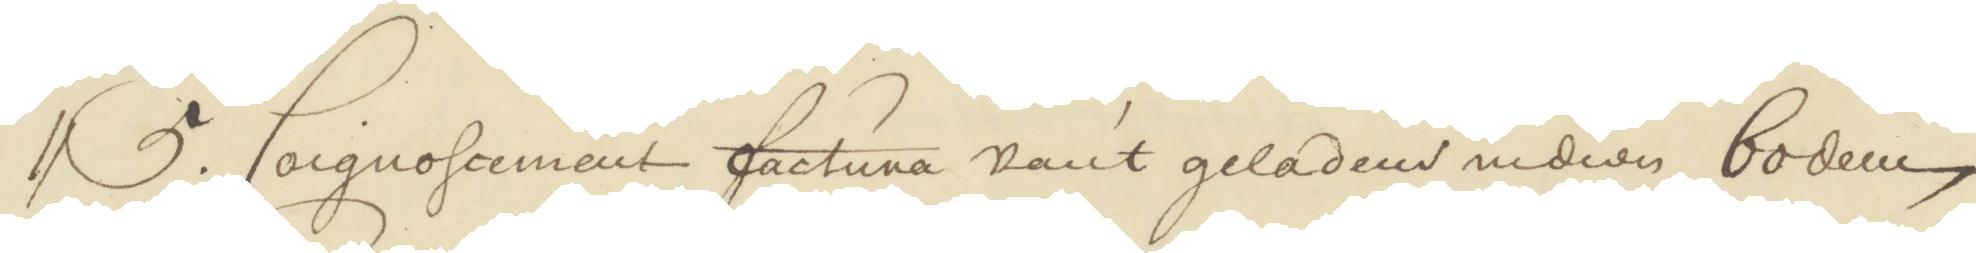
„ 5. Coignoscement factura van't geladene indien bodem
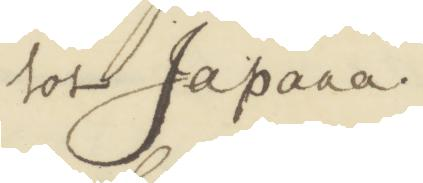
tot Japara.
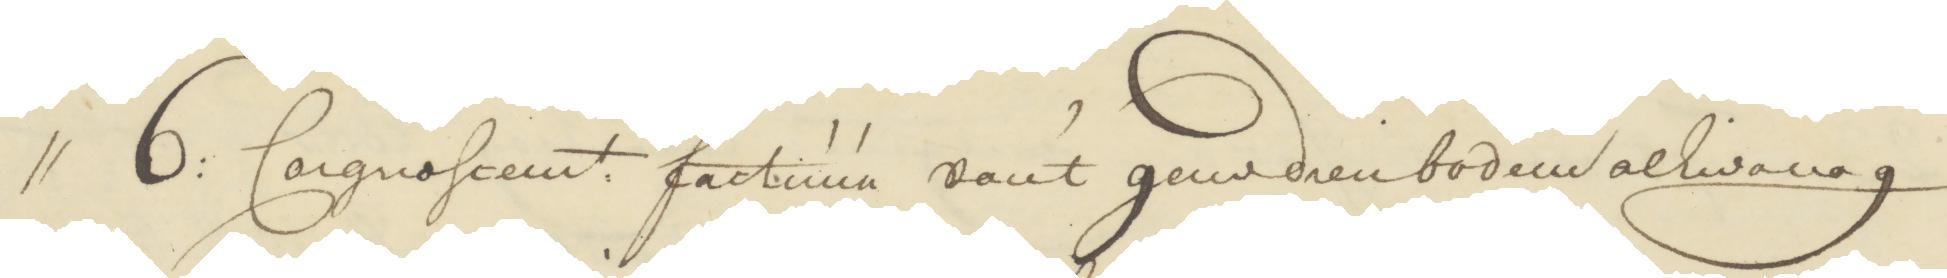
„ 6: Coignoscem:t factuur van't gene dien bodem alhier nog
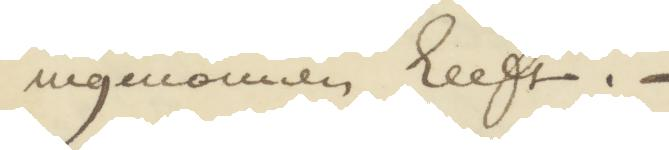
ingenomen heeft. —
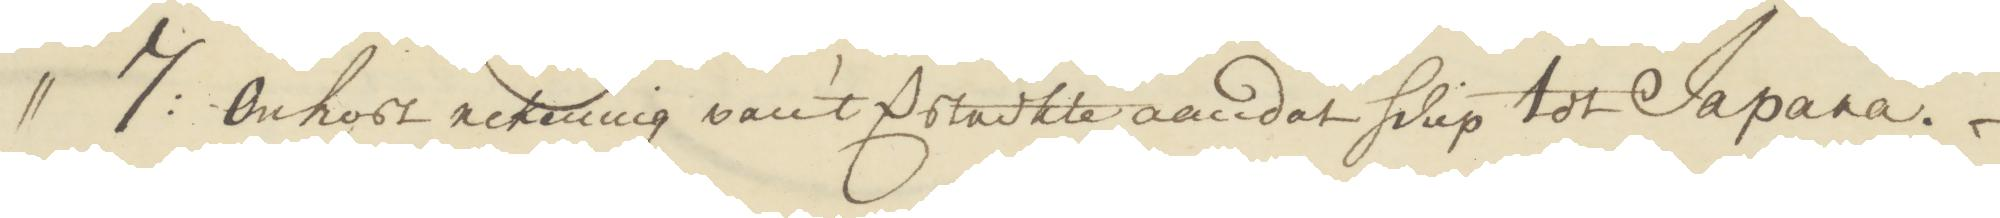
„ 7: Onkost rekening van’t verstrekte aan dat schip tot Iapara. —
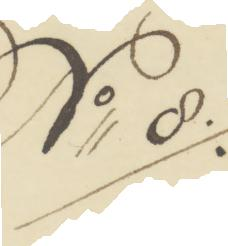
N„o 8 ./.
